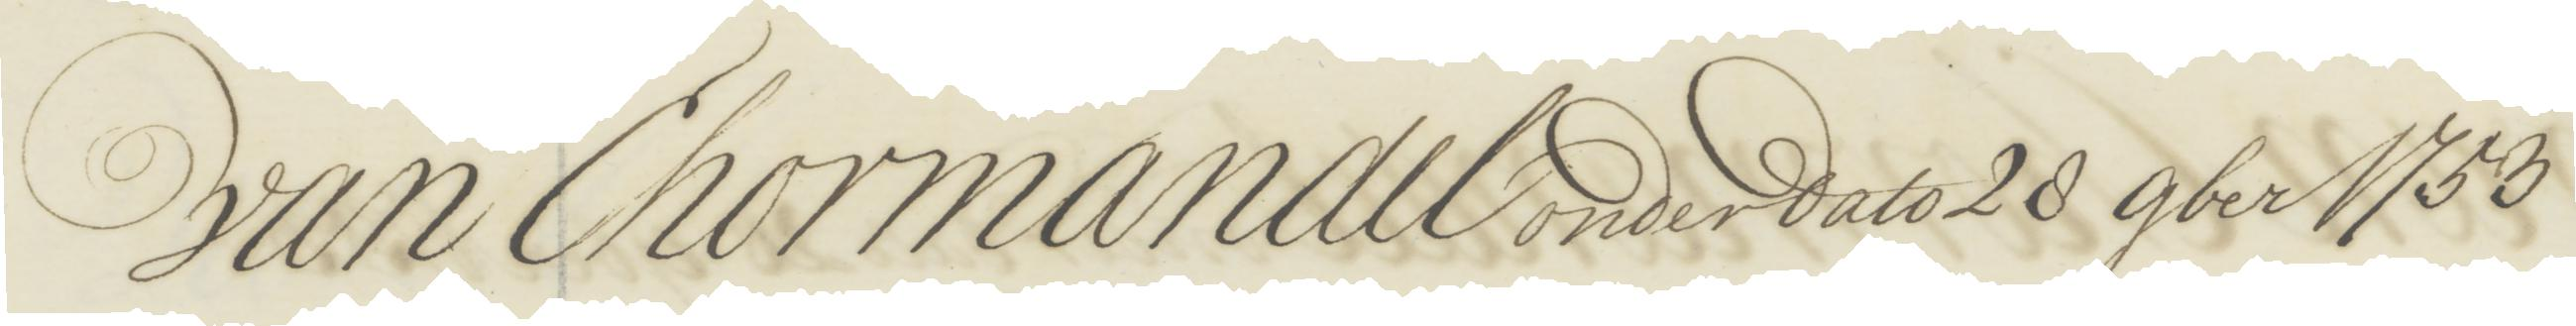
Van Chormandel onder dato 28 gber 1753
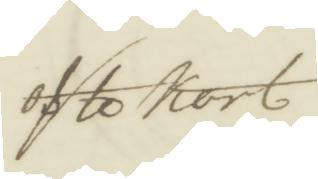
over te kort
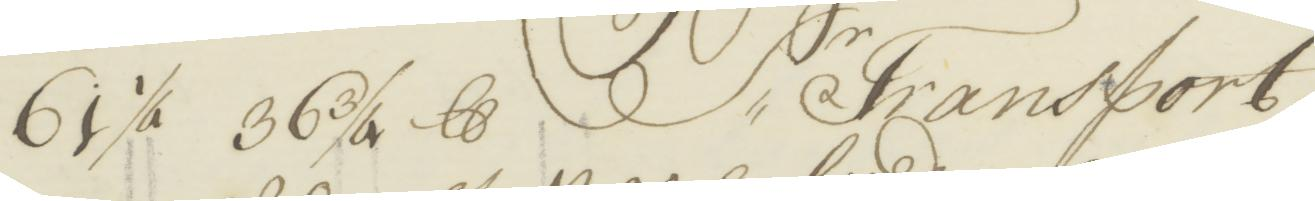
61 1/4 36 ¾ lb P„r Transport
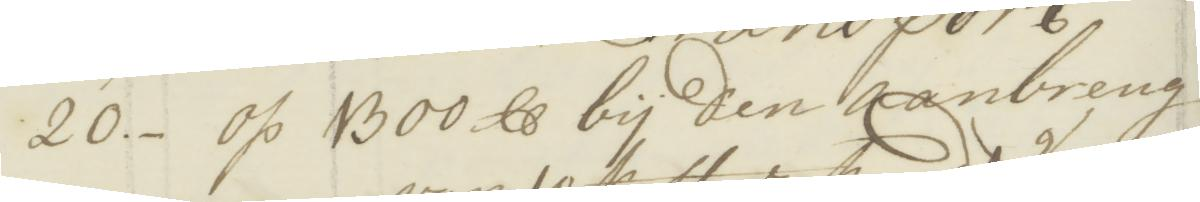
20. - op 1300 lb bij den aanbreng
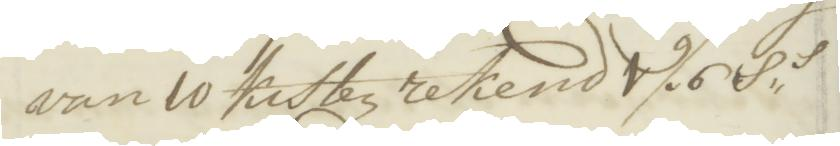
van 10 kisten rekend 1 9/16 S„s
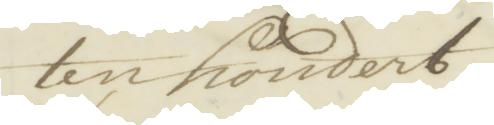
ten hondert
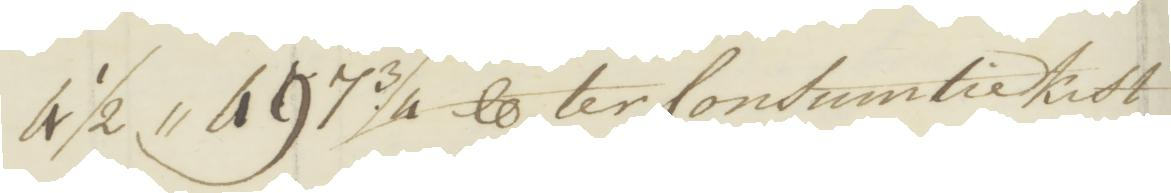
4 ½ „ 497 ¾ lb ter Consumtie kist
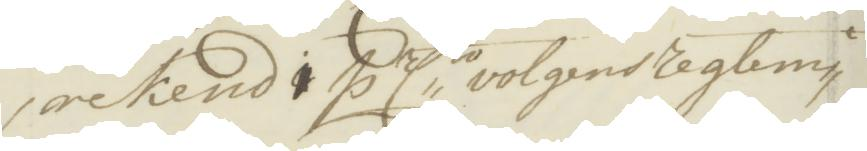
rekend 1 p:r C„to volgens reglem„t
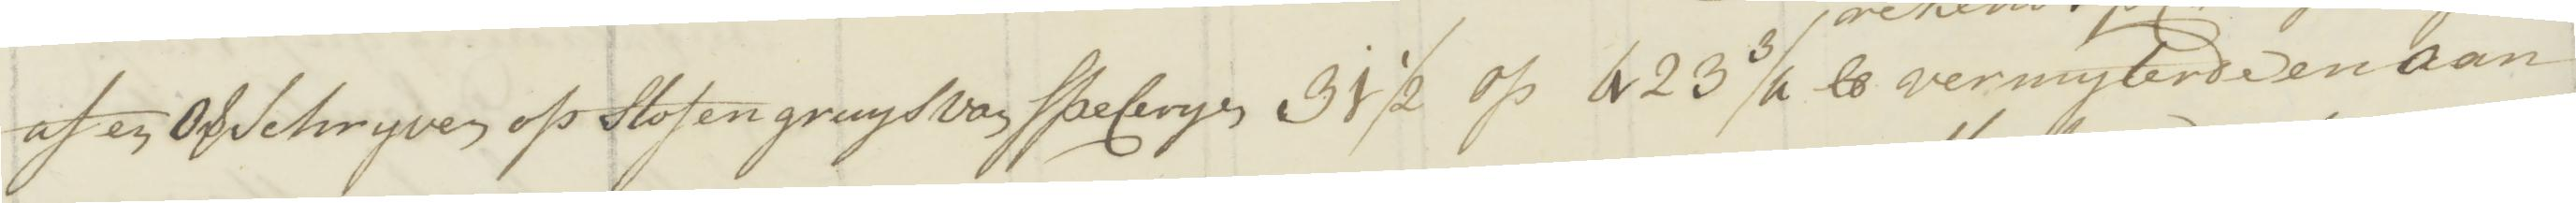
af en overschryven op stof en gruys van specerijen 31 ½ op 423 3/4 lb vermyterde en aan
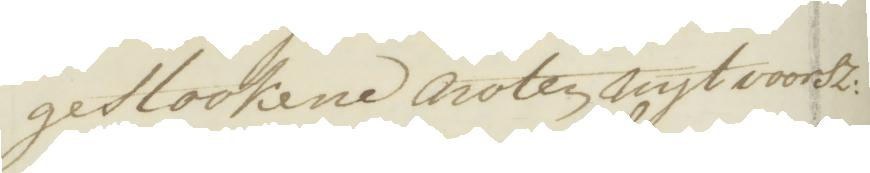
gestookene noten uyt voorsz:
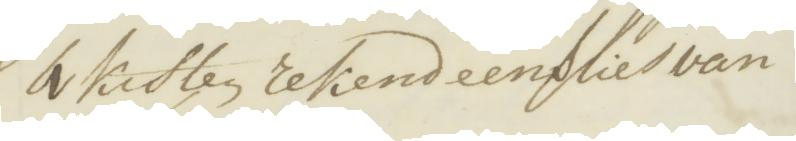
4 kisten rekend een verlies van
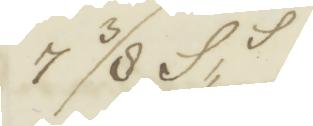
7 3/8 S„s
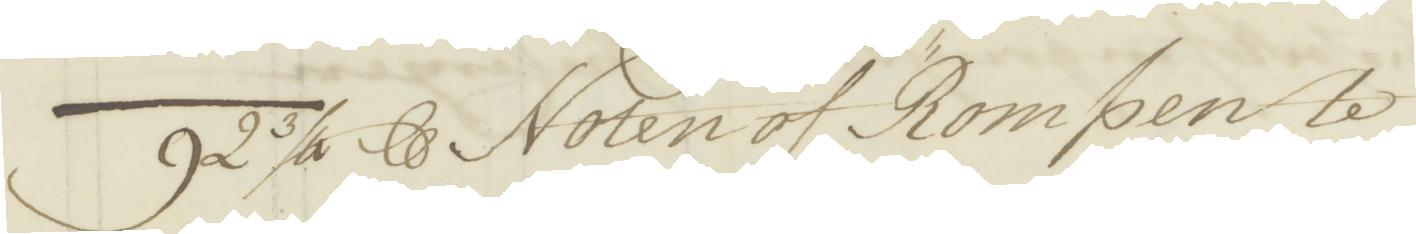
92 3/4 lb Noten of Rompen te
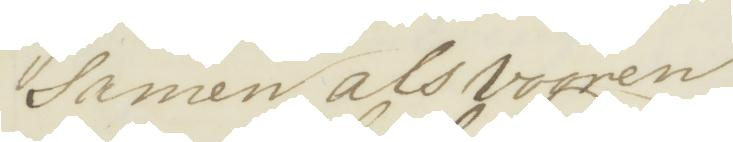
samen als vooren
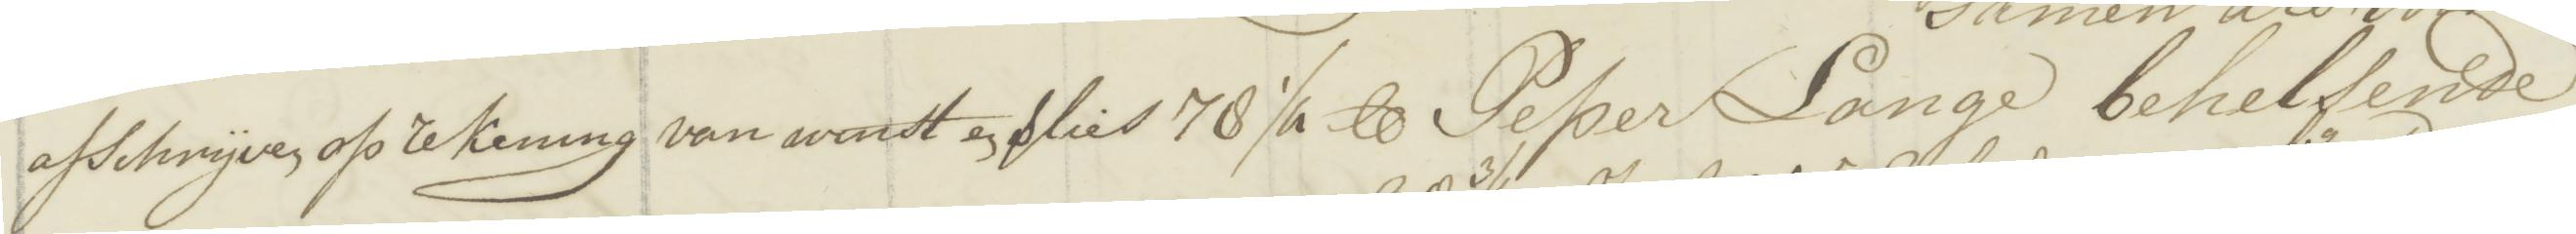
afschrijven op rekening van winst en verlies 78 ¼ lb Peper Lange behelsende
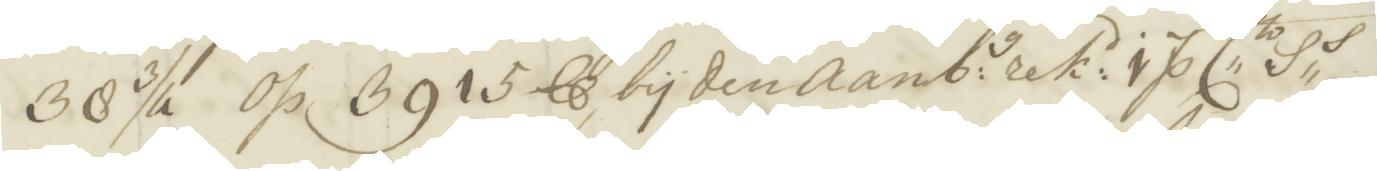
38 3/4 op 3915 lb bij den aanb:g rek:d 1 pr C„to S„s
